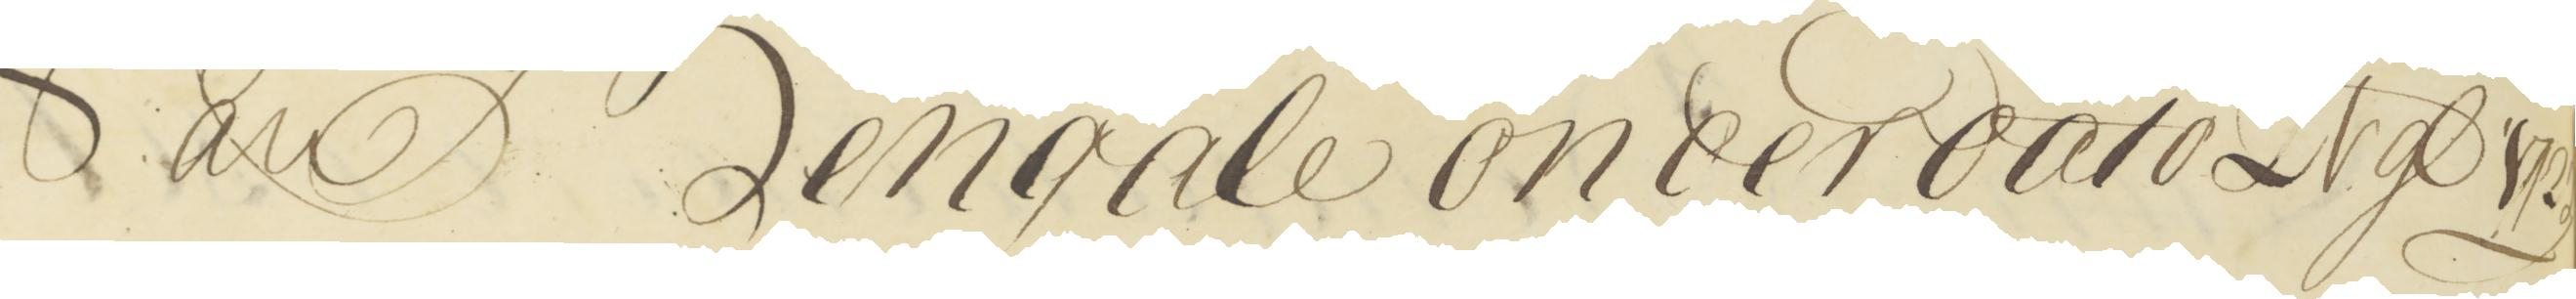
Van Bengale onder dato 21 9b 172
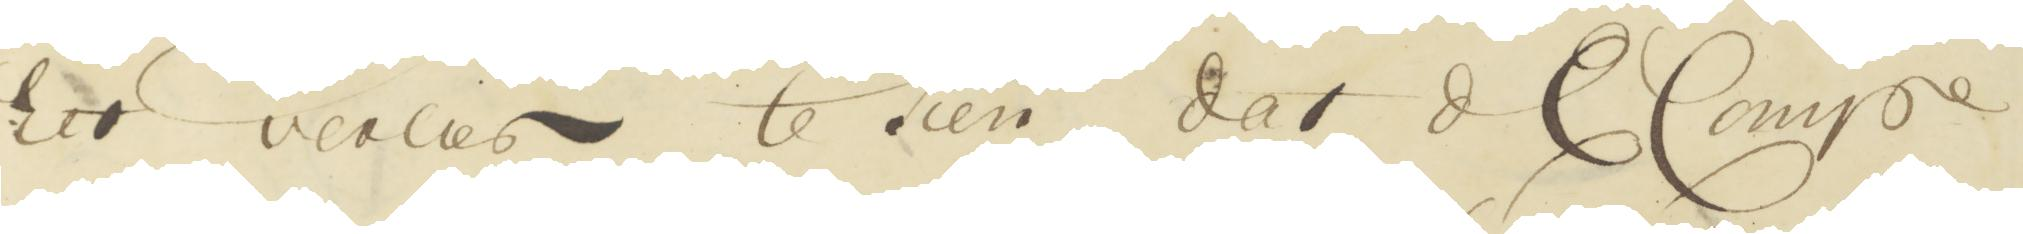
het verlies te Sien dat d E Comp:e
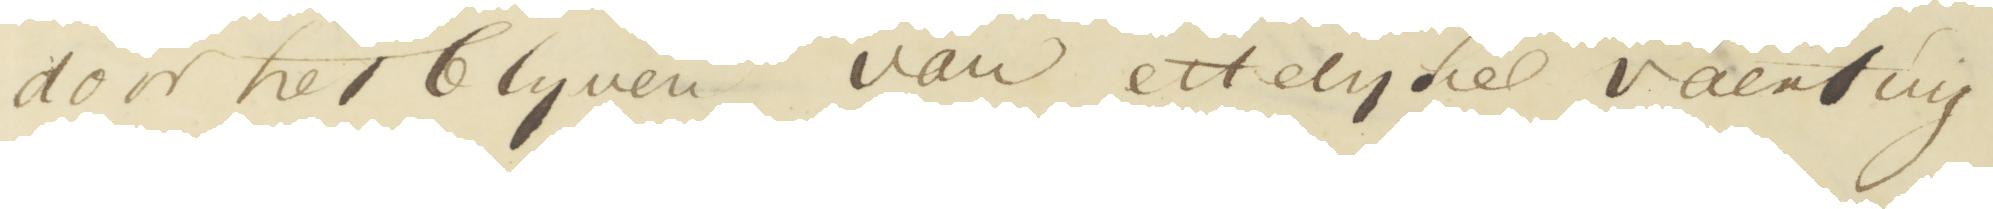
door het blyven van ettelyke vaertuij
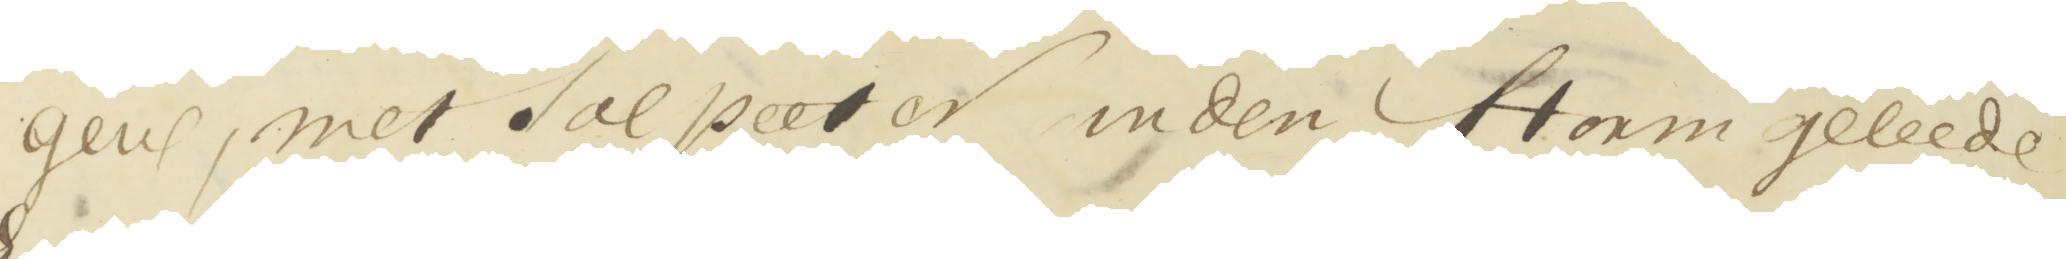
gen, met Salpeeter in den Storm geleede
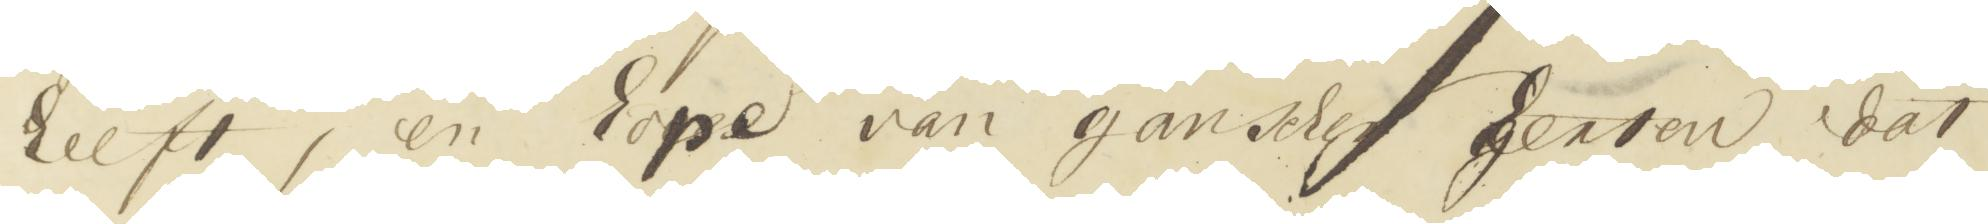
heeft, en hope van ganscher herten, dat
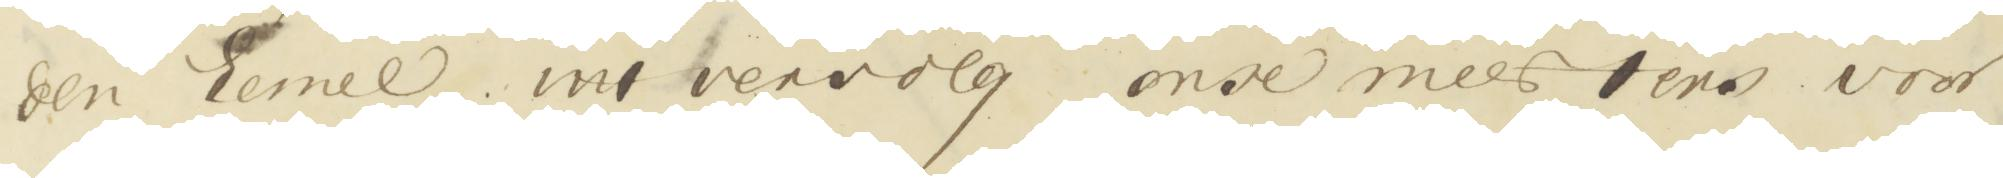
den hemel int vervolg onse meesters voor
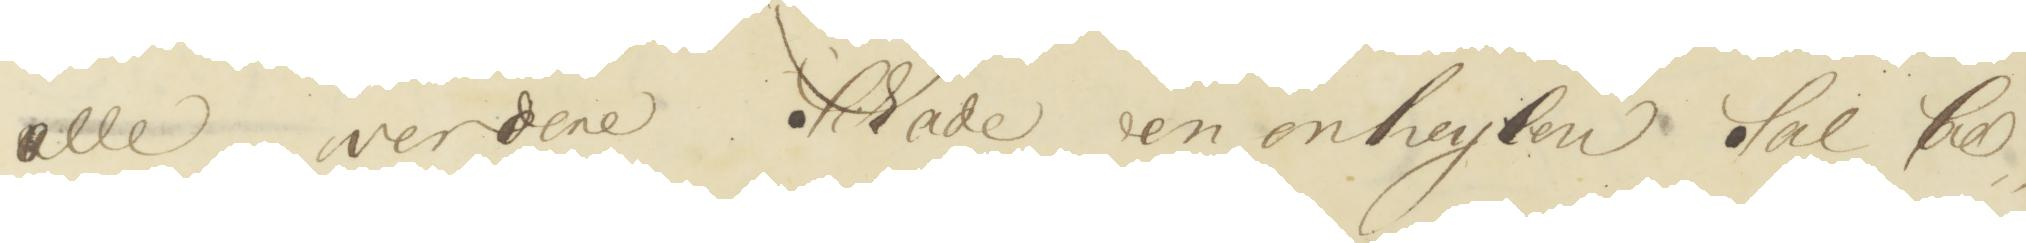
alle verdere Schade en onheylen Sal be„
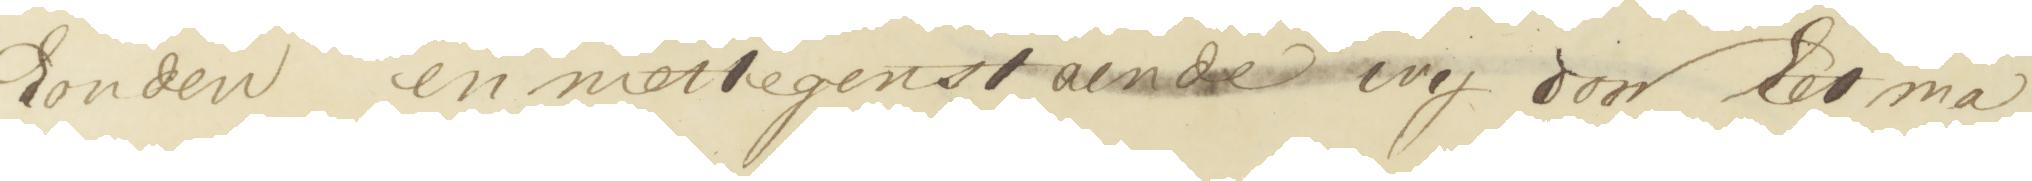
houden en niet tegenstaende wy door het ma
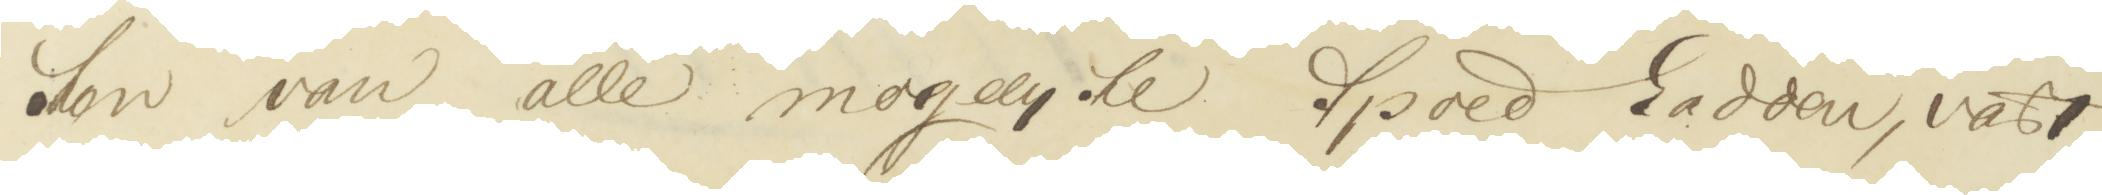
ken van alle mogelyke Spoed hadden, vast
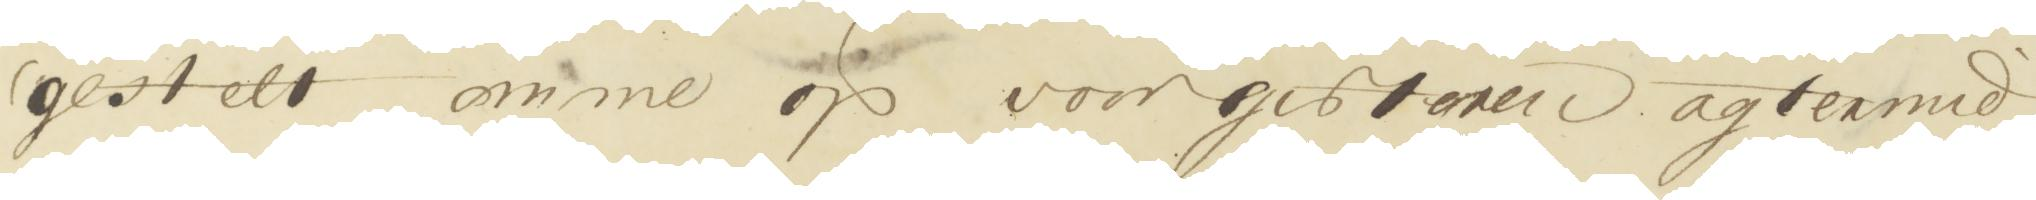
gestelt omme op voor gesteren agtermid'
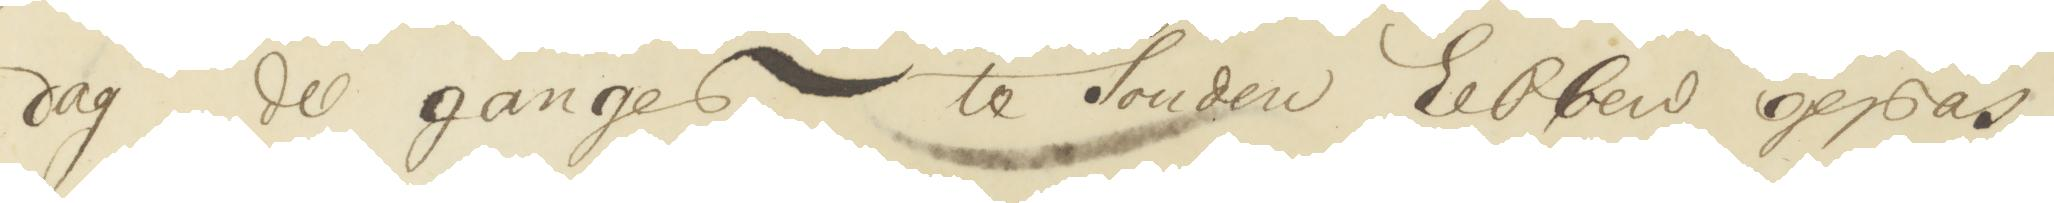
dag de ganges te Souden hebben gepas,
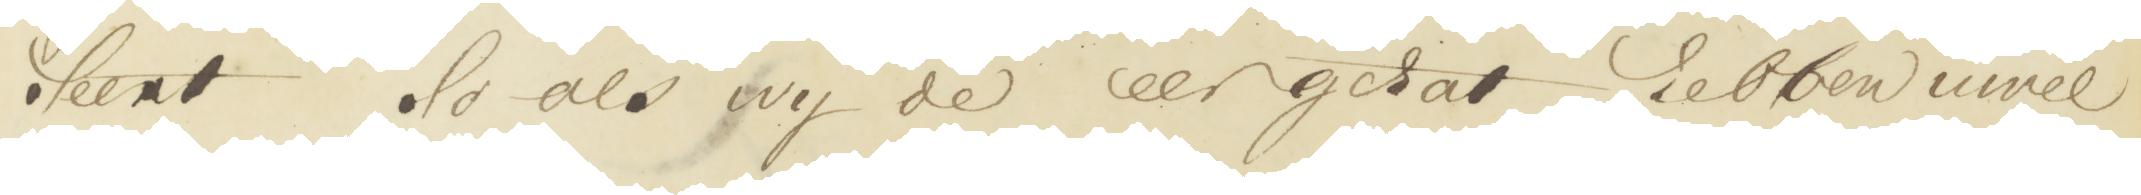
seert So als wy de eer gehat hebben u wel
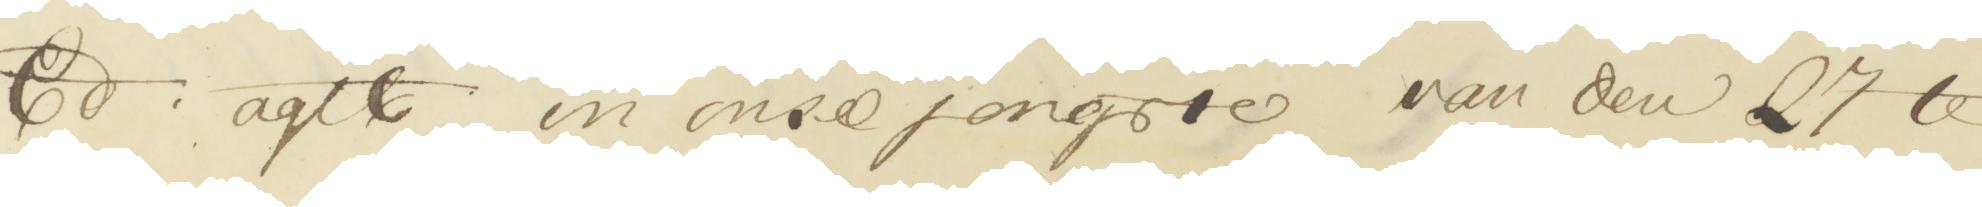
Ed: agtb: in onse jongste van den 27 te
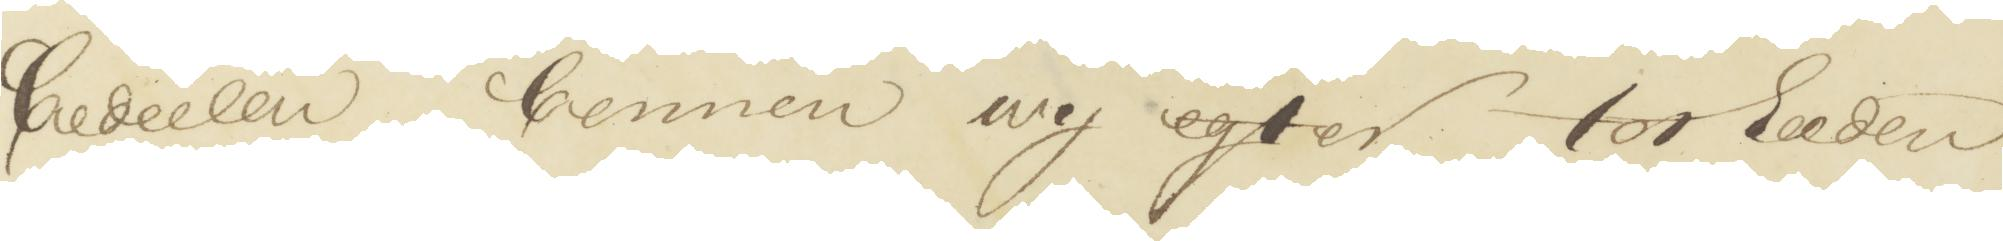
bedeelen bennen wy egter tot heeden
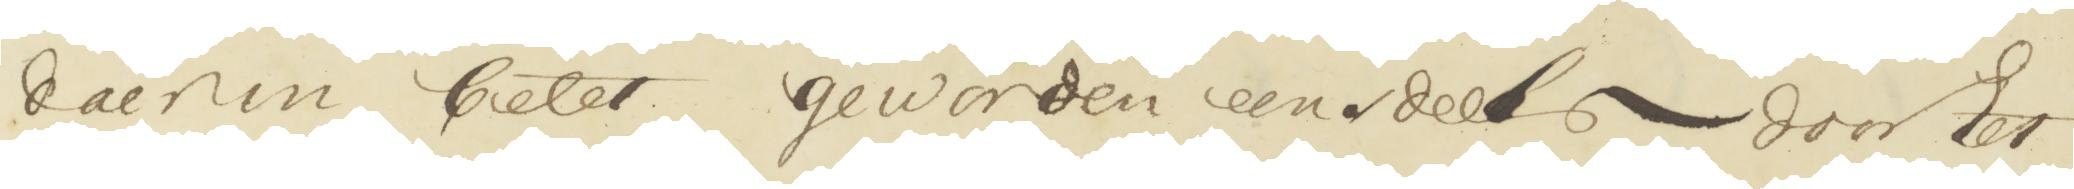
daerin belet geworden eensdeels door het
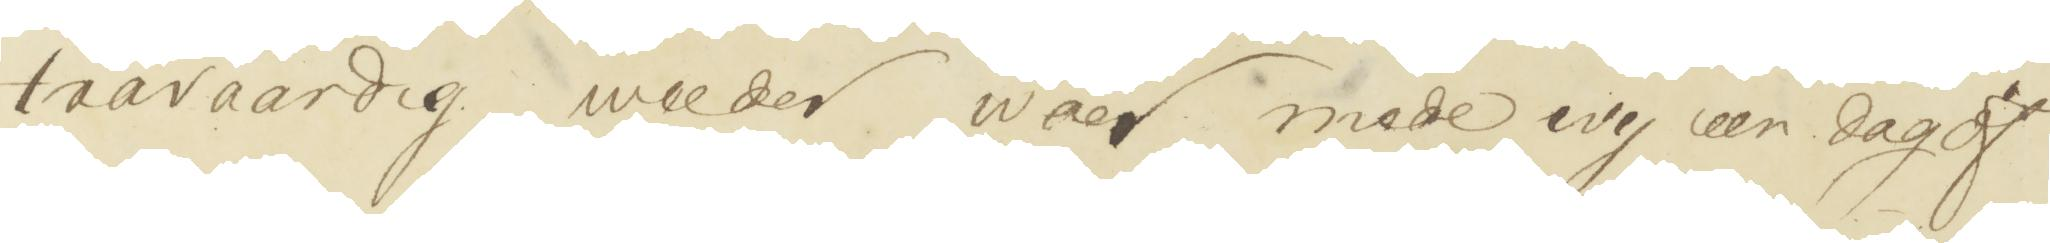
travaardig weeder waer mede wy een dag of
